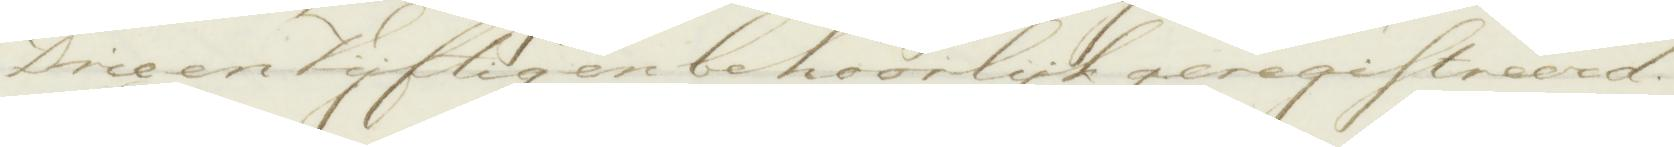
Drie en Vijftig en behoorlijk geregistreerd.
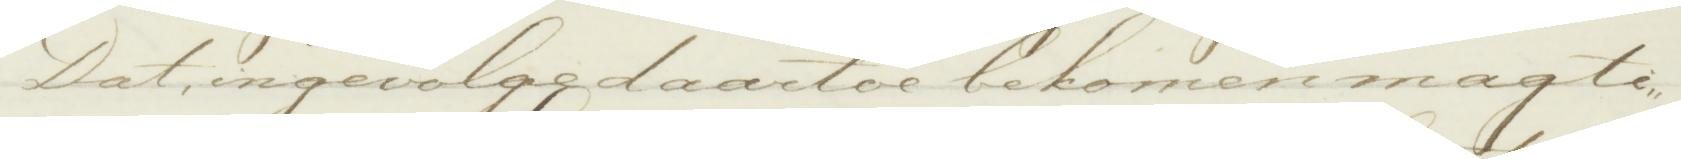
Dat, ingevolge daartoe bekomen magti„
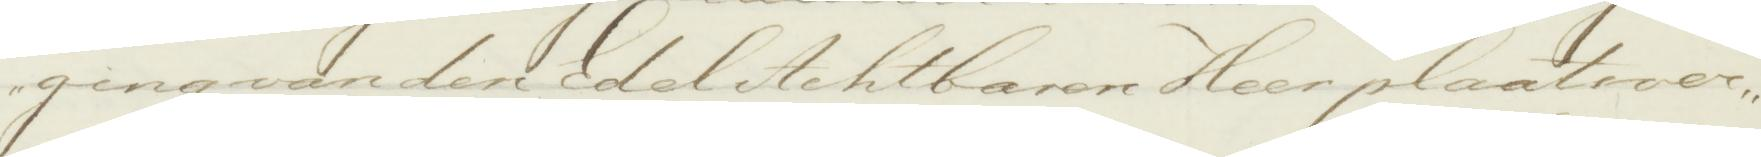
„ging van den Edel Achtbaren Heer plaatsver„
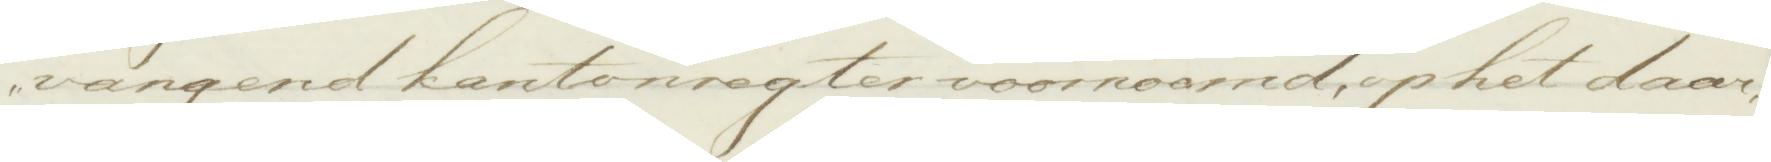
„vangend kantonregter voornoemd, op het daar„
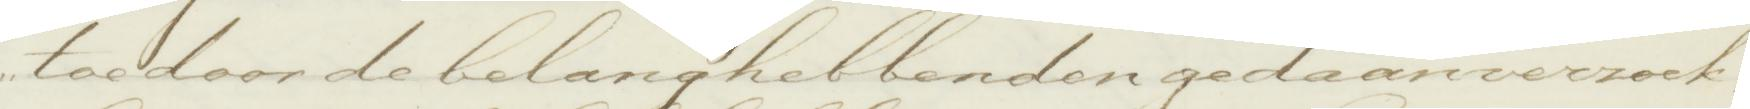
„toe door de belanghebbenden gedaanverzoek,
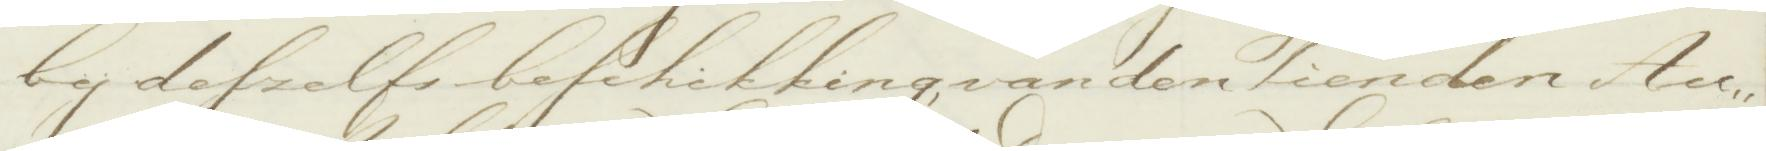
bij deszelfs beschikking, van den Tienden Au„
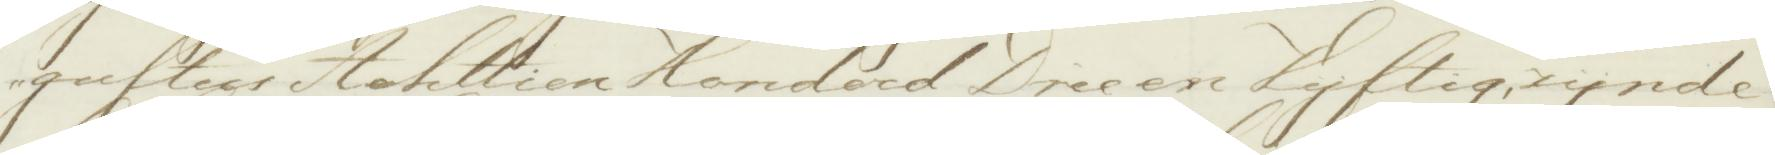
„gustus Achttien Honderd Drie en Vijftig, zijnde
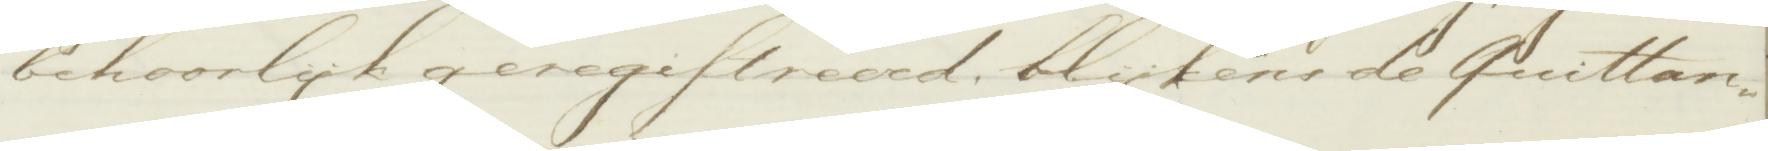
behoorlijk geregistreerd, blijkens de Quittan„
